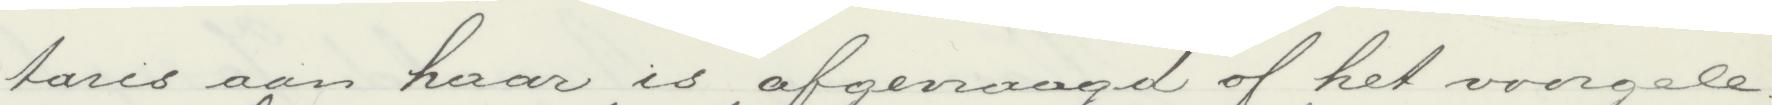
taris aan haar is afgevraagd of het voorgele
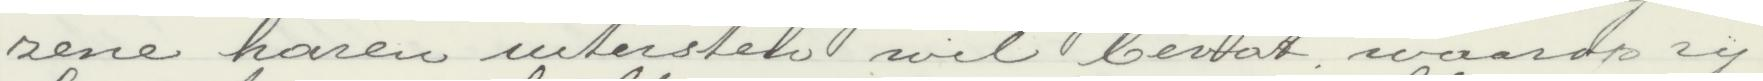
zene haren uitersten wil bevat, waarop zij
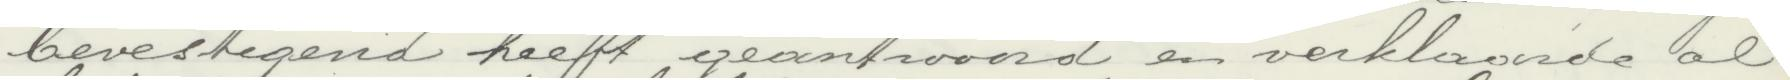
bevestigend heeft geantwoord en verklaarde al
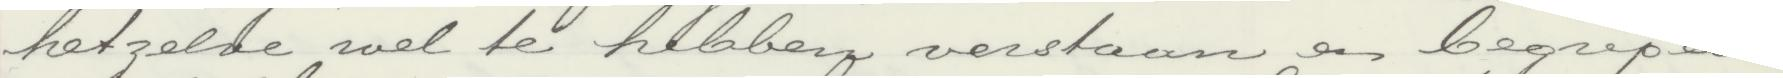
hetzelve wel te hebben verstaan en begrepen
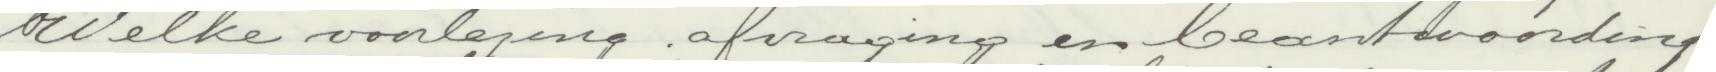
Welke voorlezing, afvraging en beantwoording
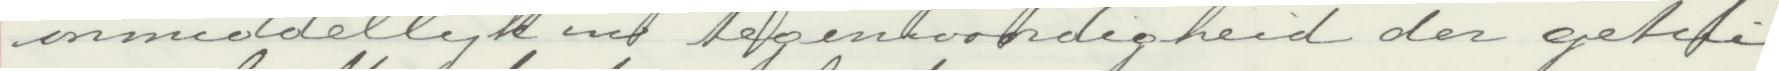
onmiddellyk in tegenwoordigheid der getui
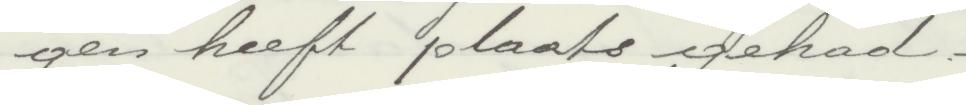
gen heeft plaats gehad
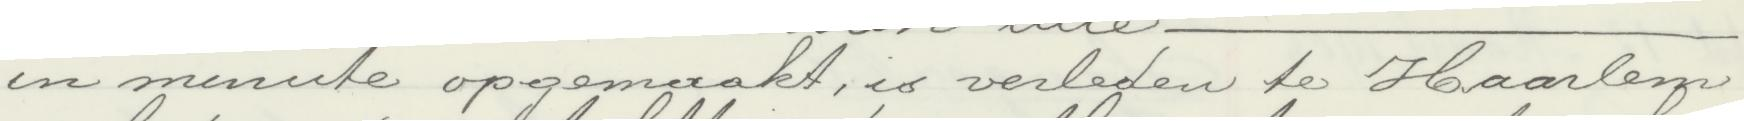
in minute opgemaakt, is verleden te Haarlem
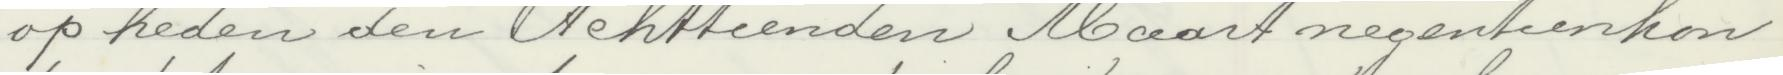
op heden den Achttienden Maart negentienhon
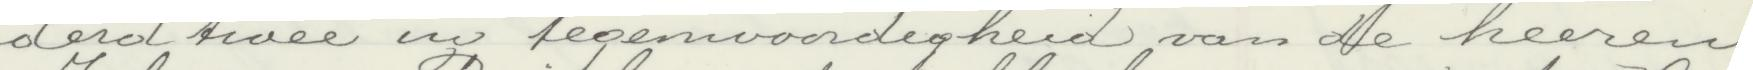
derd twee in tegenwoordigheid van de heeren
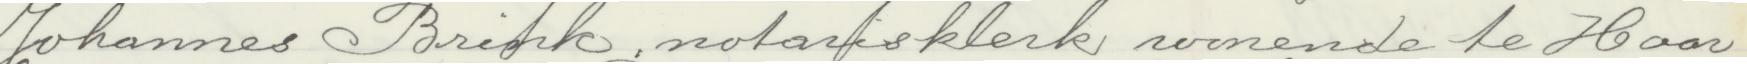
Johannes Brink, notariskerk, wonende te Haar
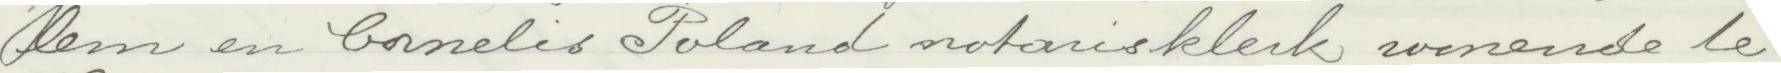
lem en Cornelis Poland notarisklerk wonende te
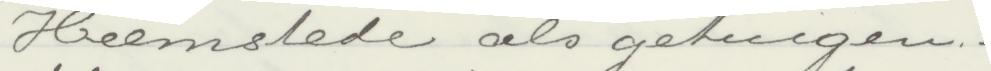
Heemstede als getuigen.
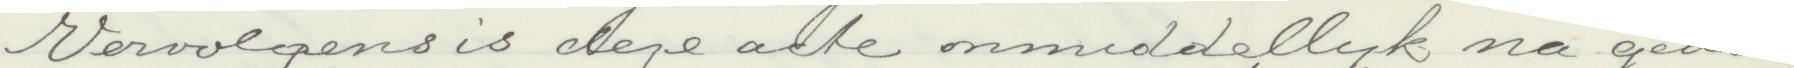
Vervolgens is deze acte onmiddellyk na geda
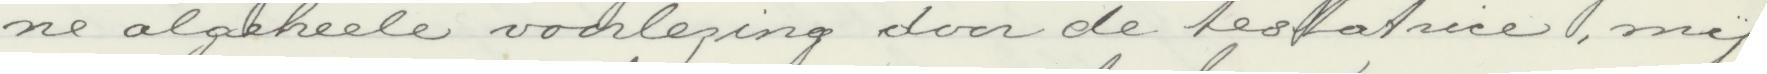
ne algeheele voorlezing door de testatrice, mij
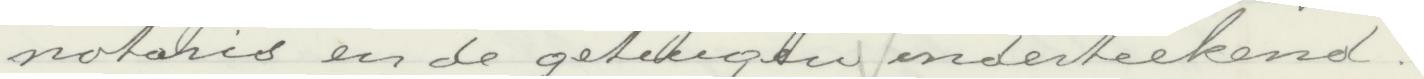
notaris en de getuigen onderteekend.
